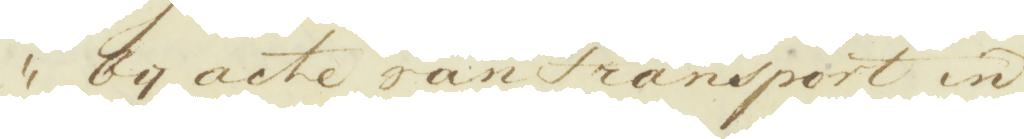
„ bij acte van Transport in
